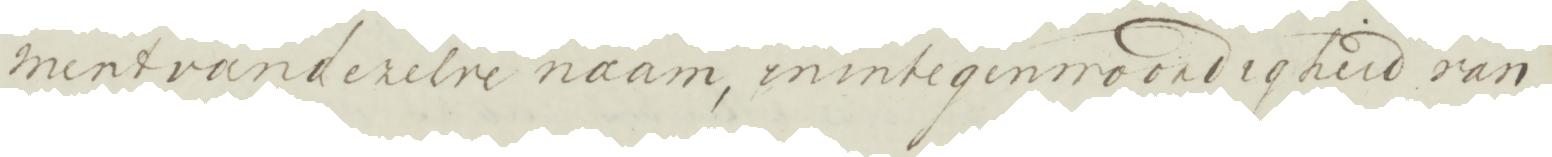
ment van dezelve naam, en integenwoordigheid van
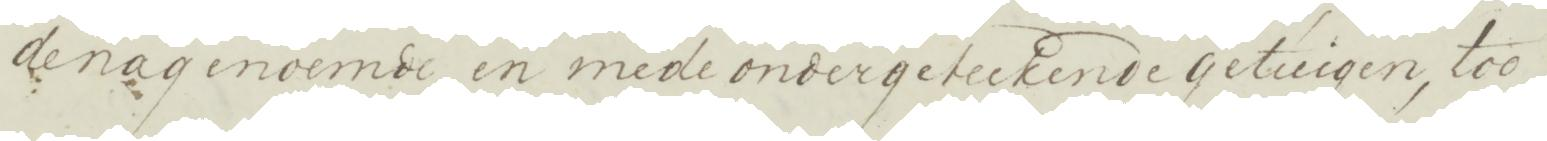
de nagenoemde en mede ondergeteekende getuigen, too
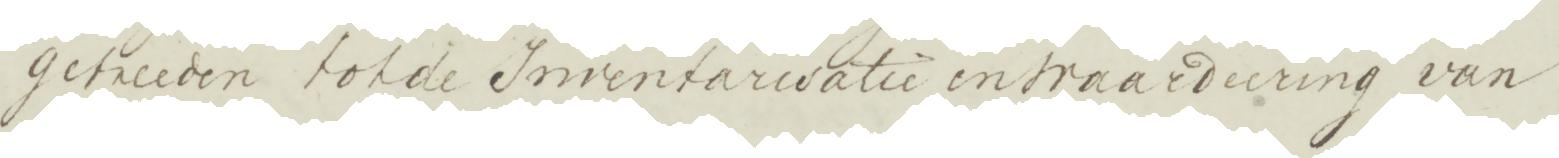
getreeden tot de Inventarisatie en waardeering van
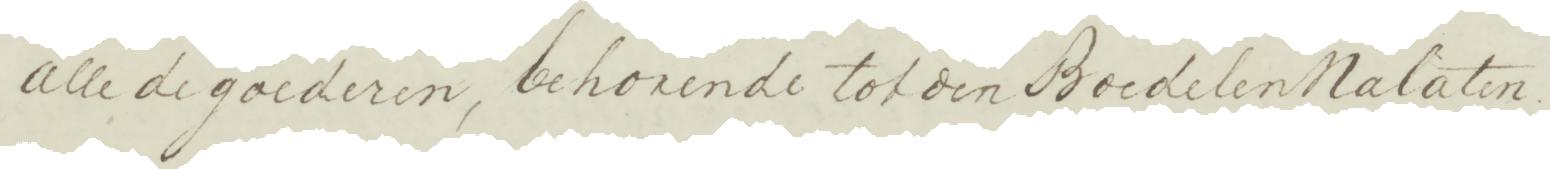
alle de goederen, behorende tot den Boedelen Nalaten.
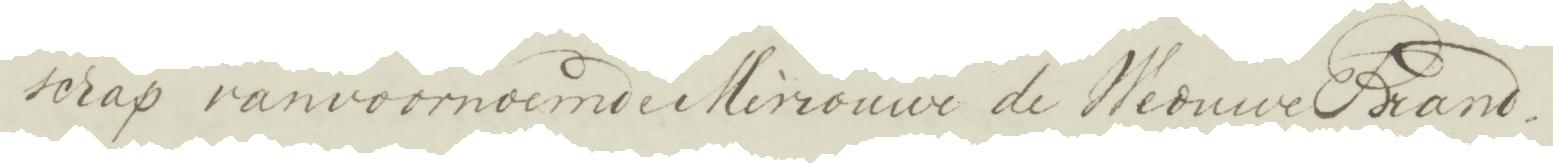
schap van voornoemde Mevrouwe de Weduwe Brand„
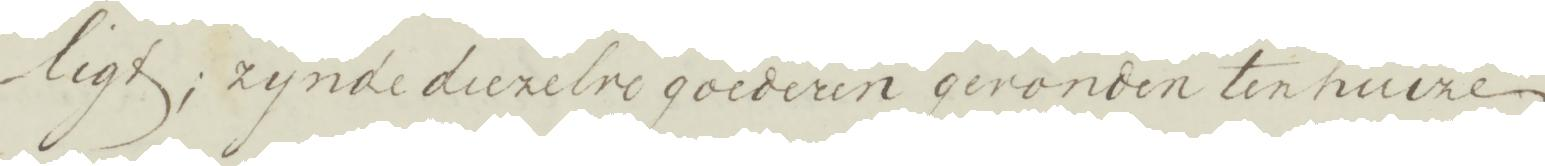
ligt; zijnde diezelve goederen gevonden ten huize
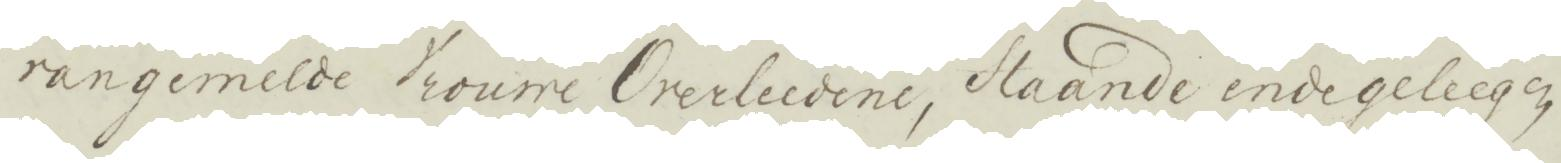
van gemelde Vrouwe Overleedene, staande ende geleegen
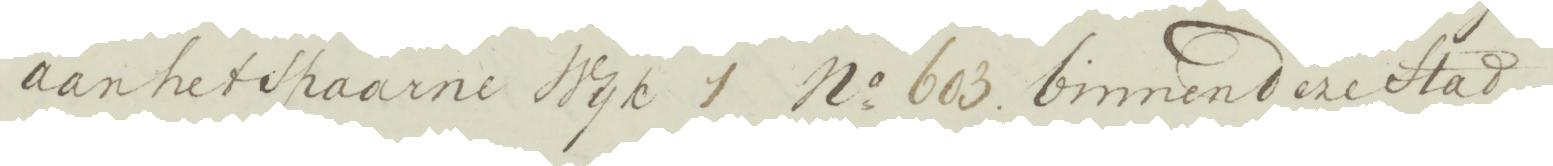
aan het spaarne Wijk 1 N=o 603. binnen deze Stad
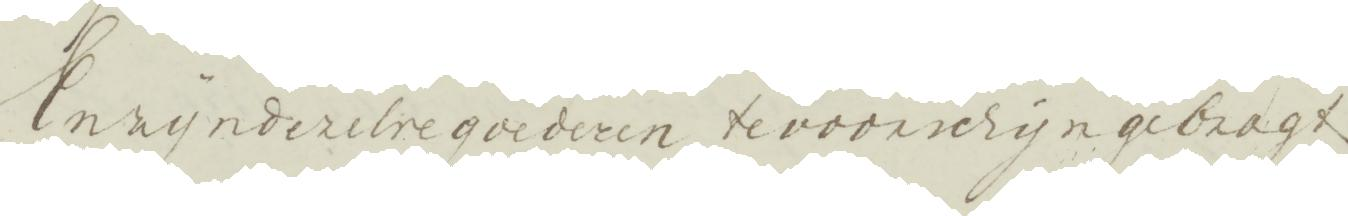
En zijn dezelve goederen te voorschijn gebragt,
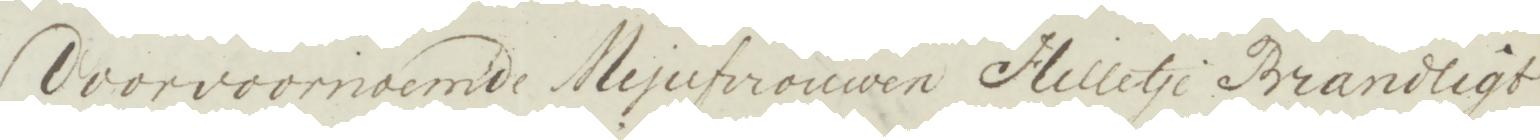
door voornoemde Mejufvrouwen Hilletje Brandligt
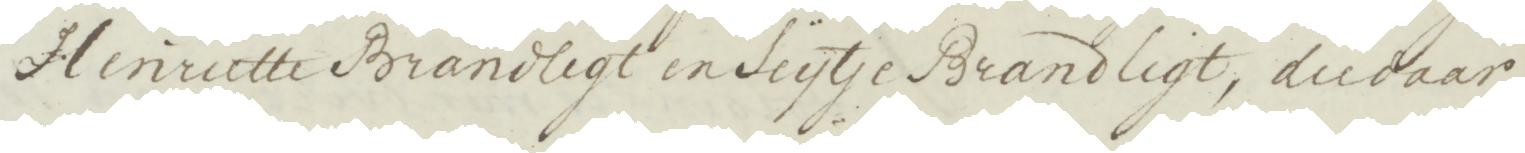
Henriette Brandligt en Seijtje Brandligt, die daar
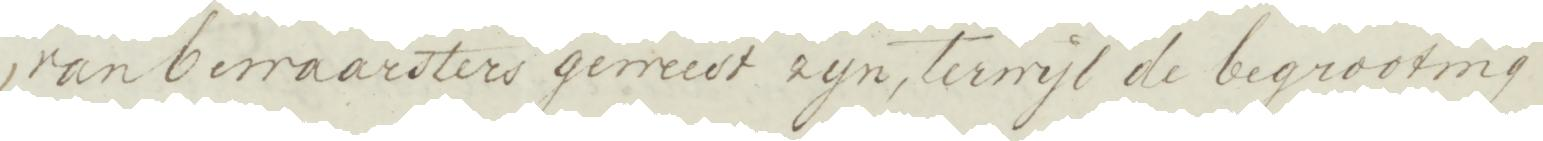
van bewaarsters geweest zijn, terwijl de begrooting
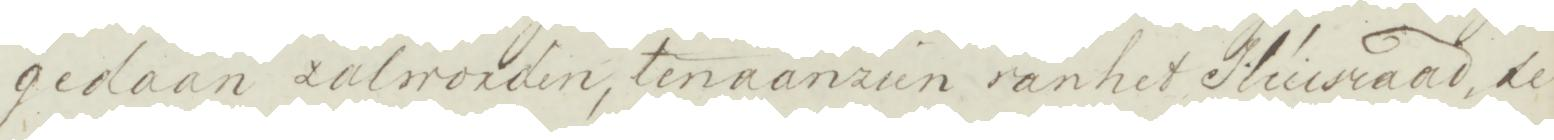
gedaan zal worden, ten aanzien van het Huisraad, de
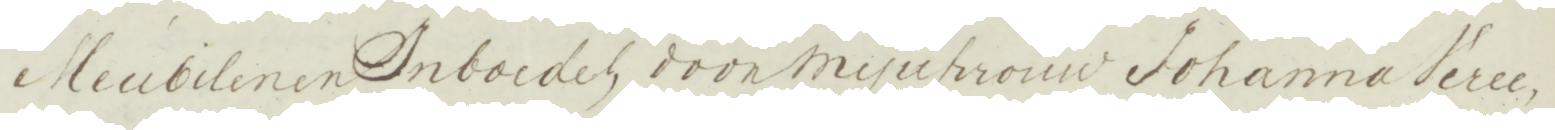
Meubelen en Inboedel door mejufvrouw Johanna Veree„
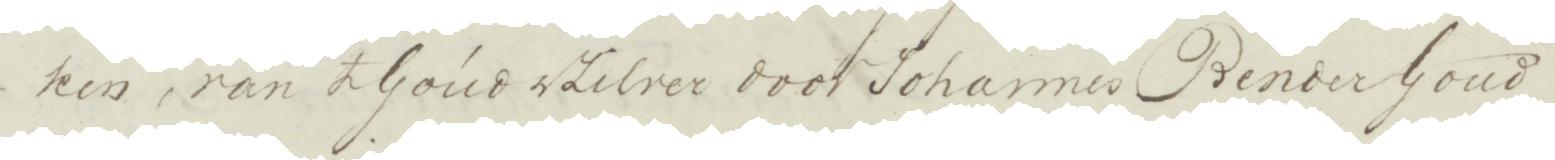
ken, van ’t Goud & Zilver door Iohannes Bender Goud
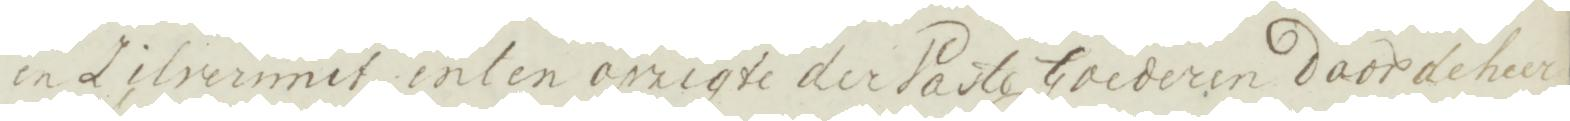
en Zilversmit, en ten opzigte der vaste Goederen door de heer
